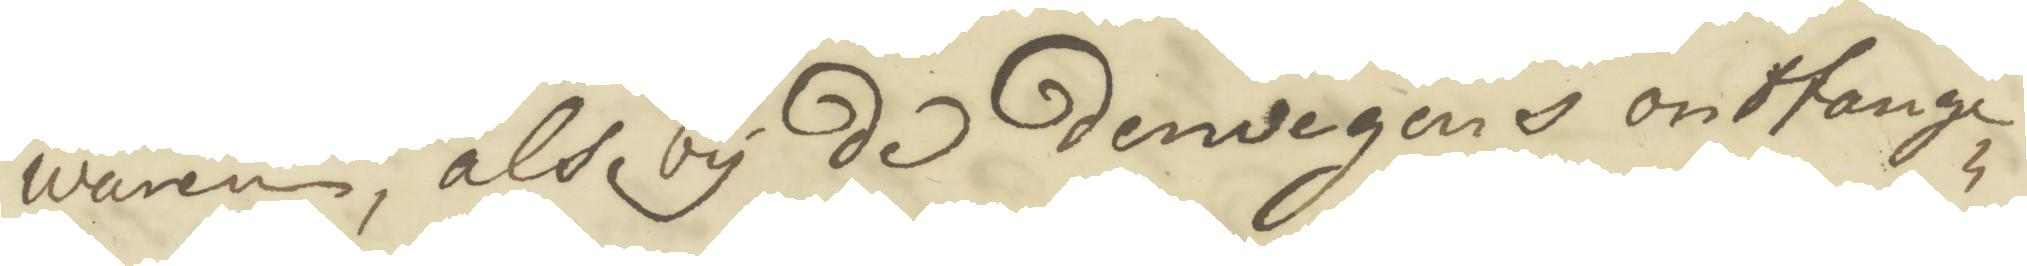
waren, als bij de denwegens ontfange„
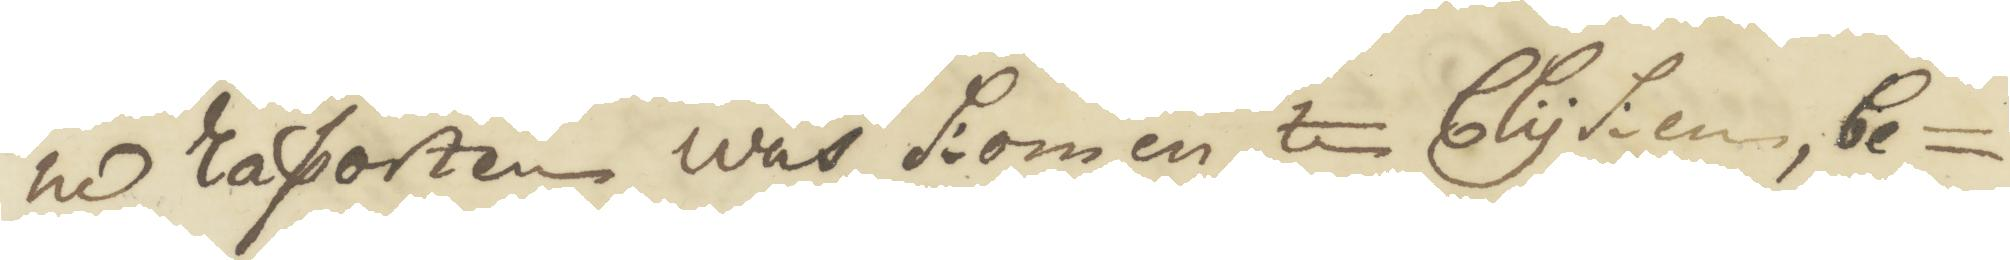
ne raporten was komen te blijken, be=
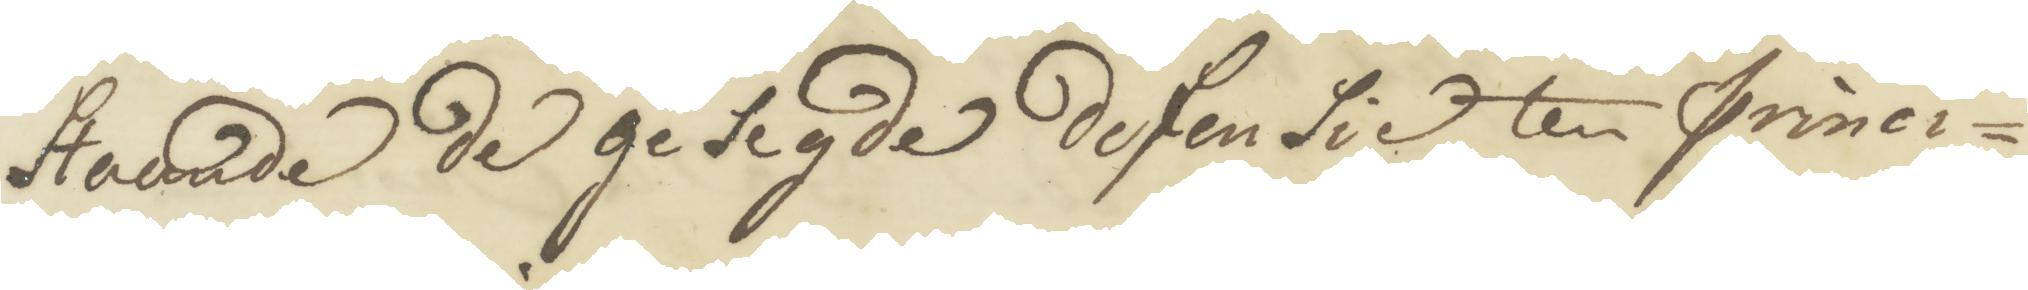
staande de gesegde defensie ten princi=
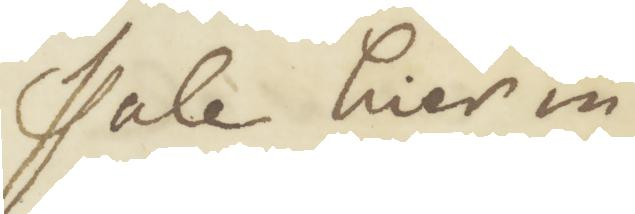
pale hier in
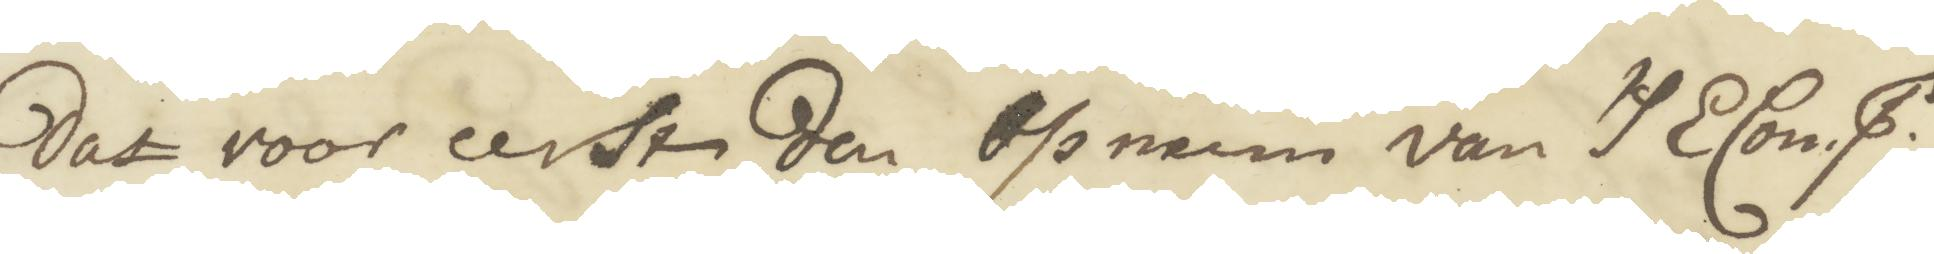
dat voor eerst den opneem van 's E Comp:
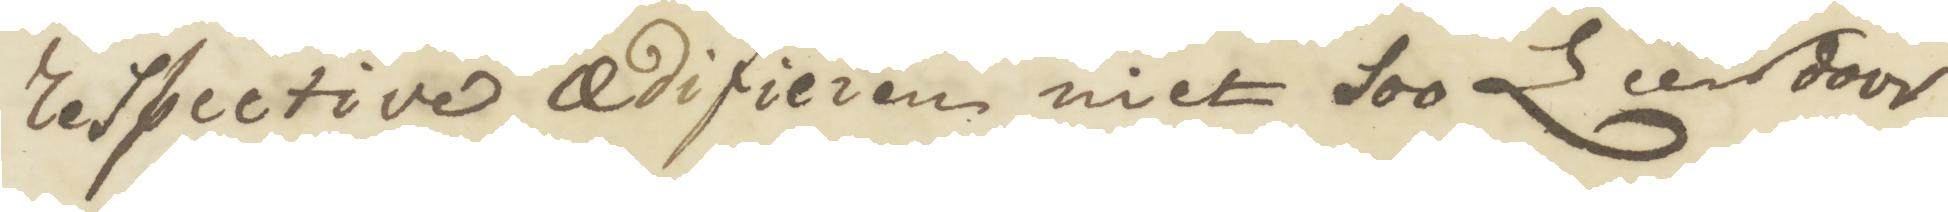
respective aedificien niet soo zeer door
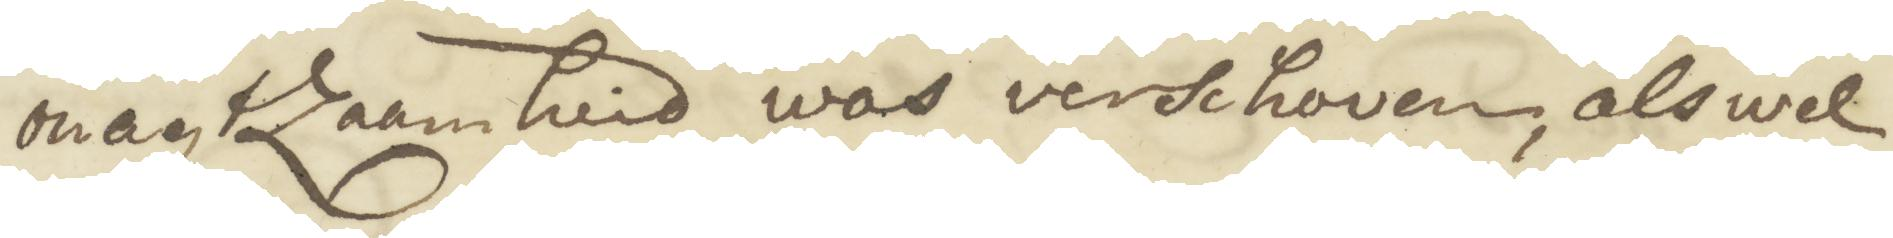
onagtzaamheid was verschoven, als wel
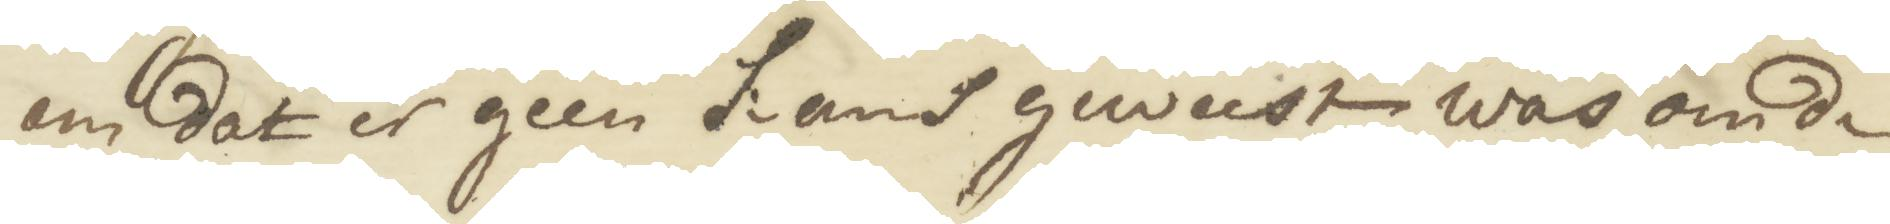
om dat er geen kans geweest was om de
